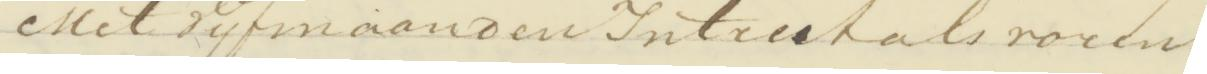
Met vyf maanden Intrest als voren
